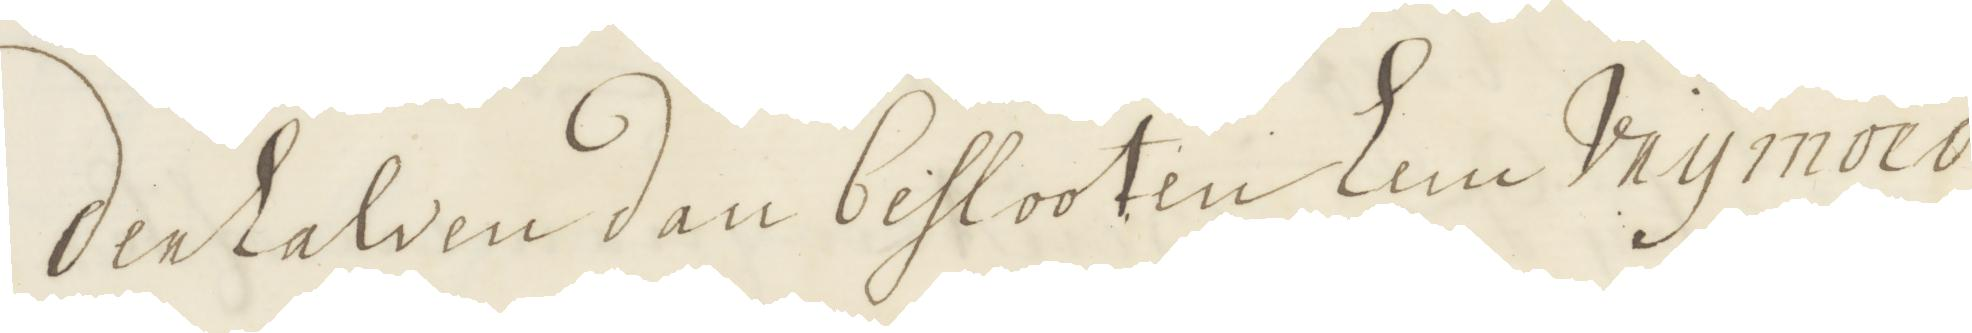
derhalven dan beslooten hem Vrijmoed
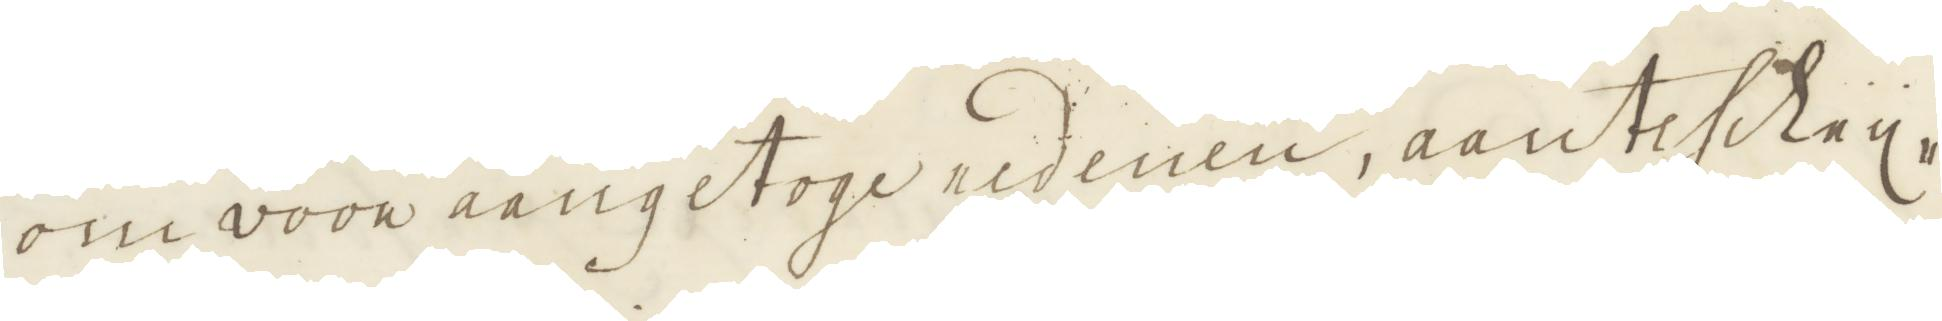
om voor aangetoge redenen, aanteschrij„
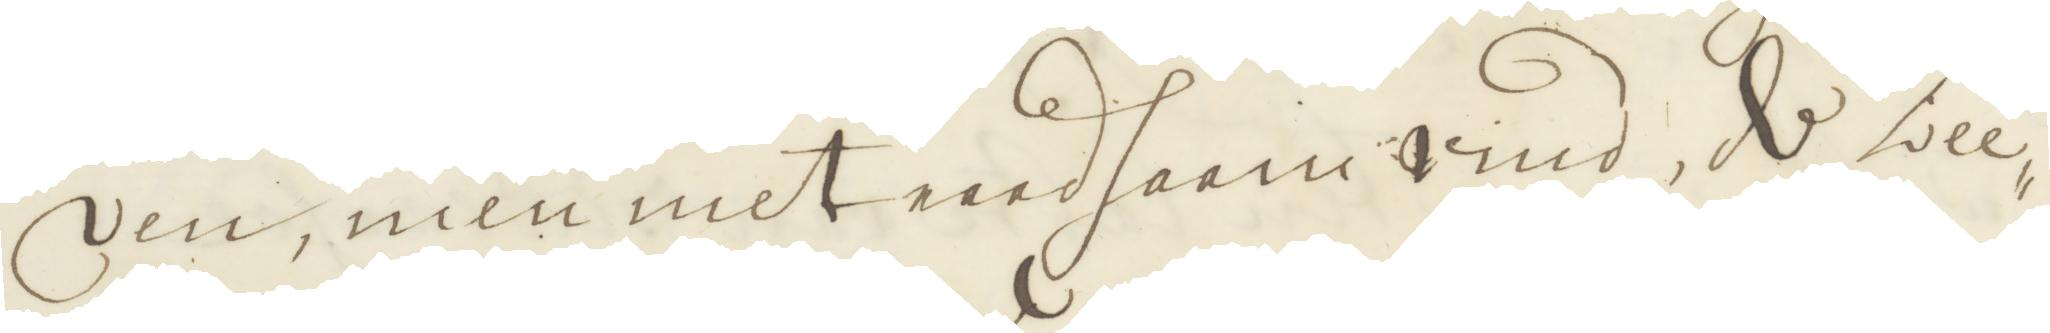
ven, men niet raadsaam vind, de zee„
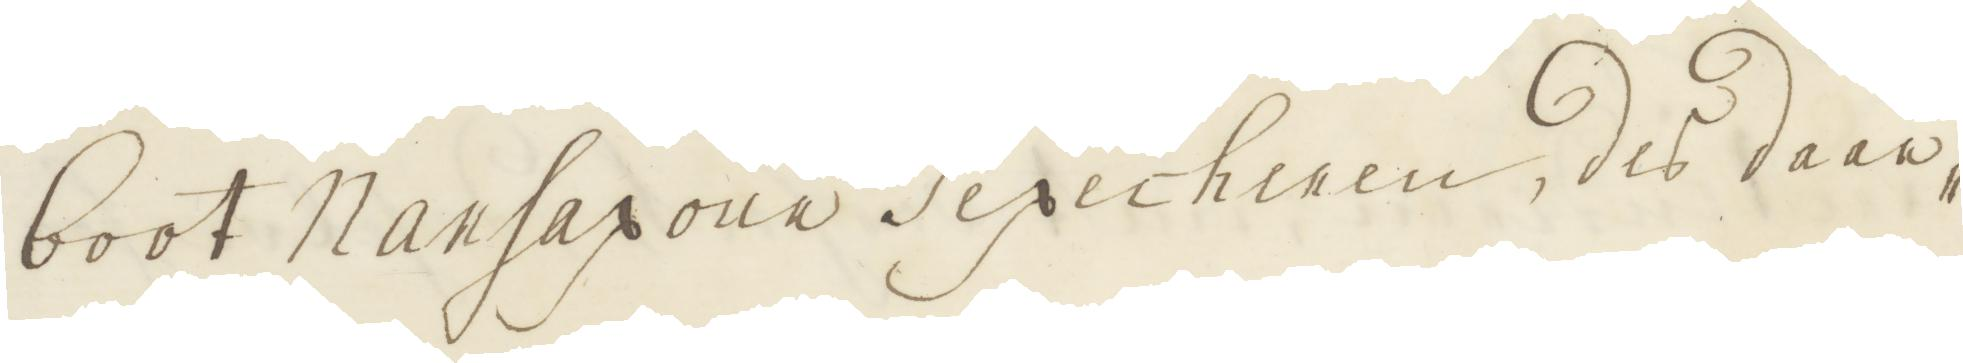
boot Narsapour Tepecheren, des daar
